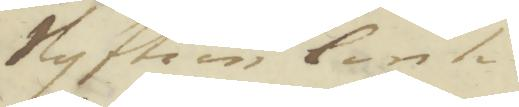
Vyftien Cents
